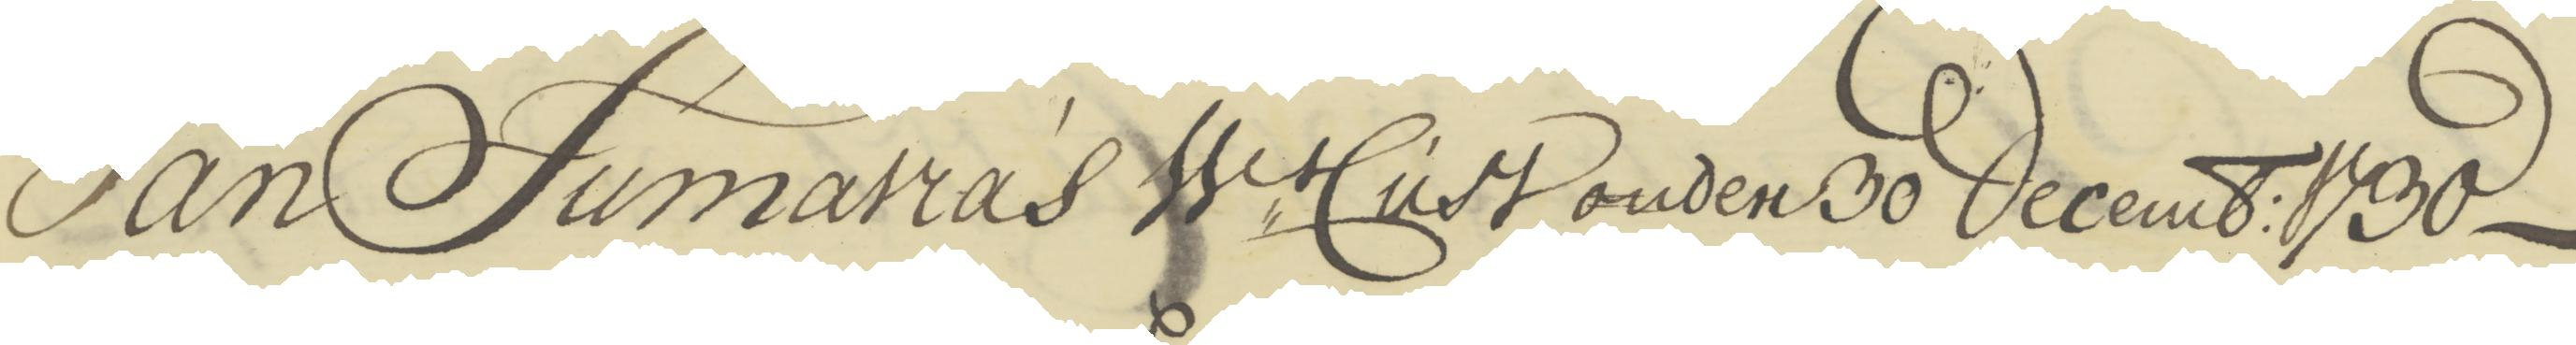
Van Sumatra's W„t Cust onder 30 Decemb: 1730—
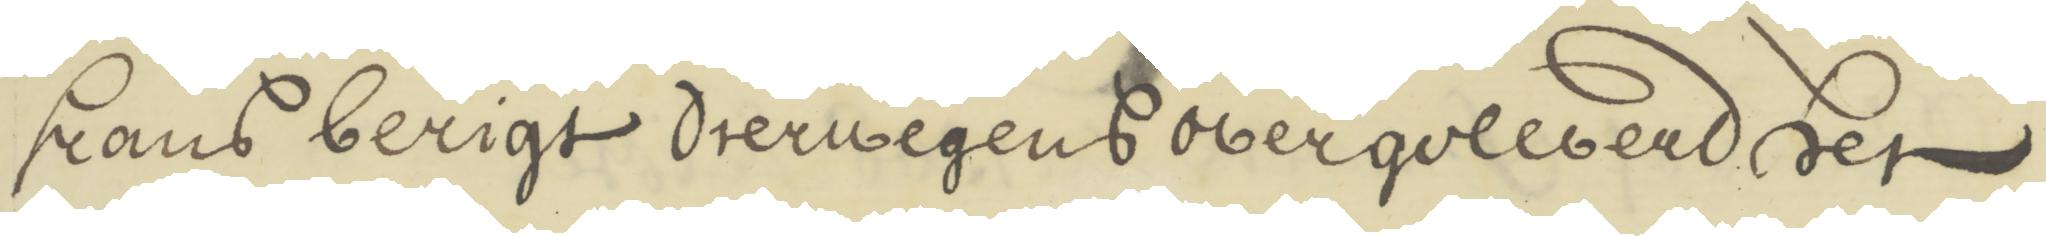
kans berigt dierwegens over geleverd het
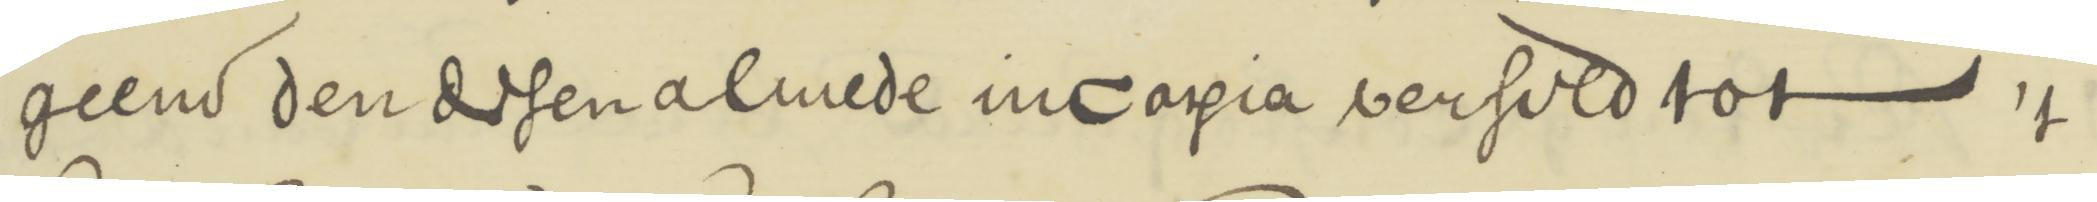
geene den desen almede in copia verseld tot 't
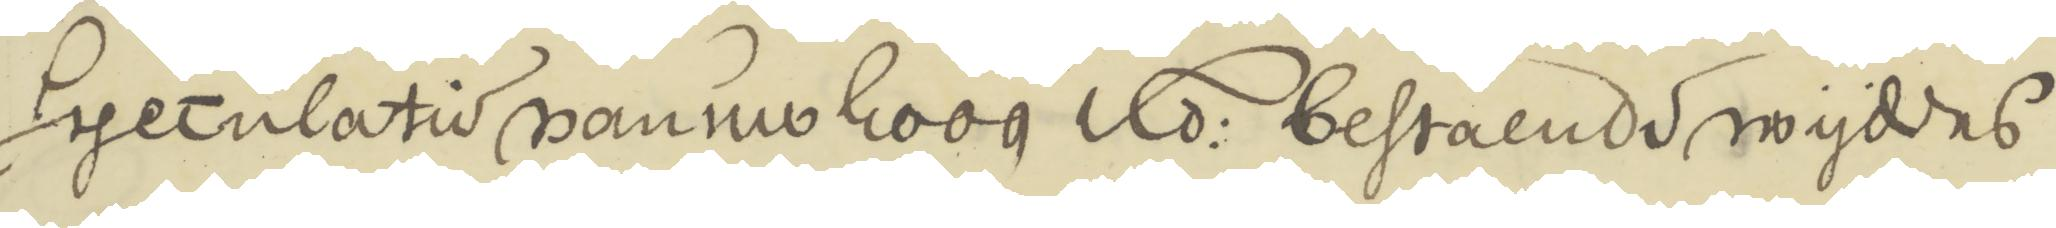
speculatie van uw hoog Ed: bestaende wijders
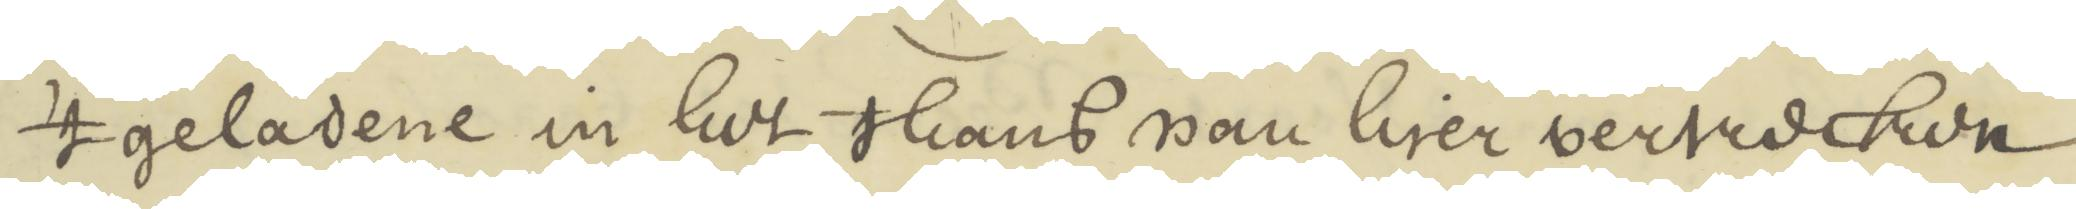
’t geladene in het thans van hier vertrecken
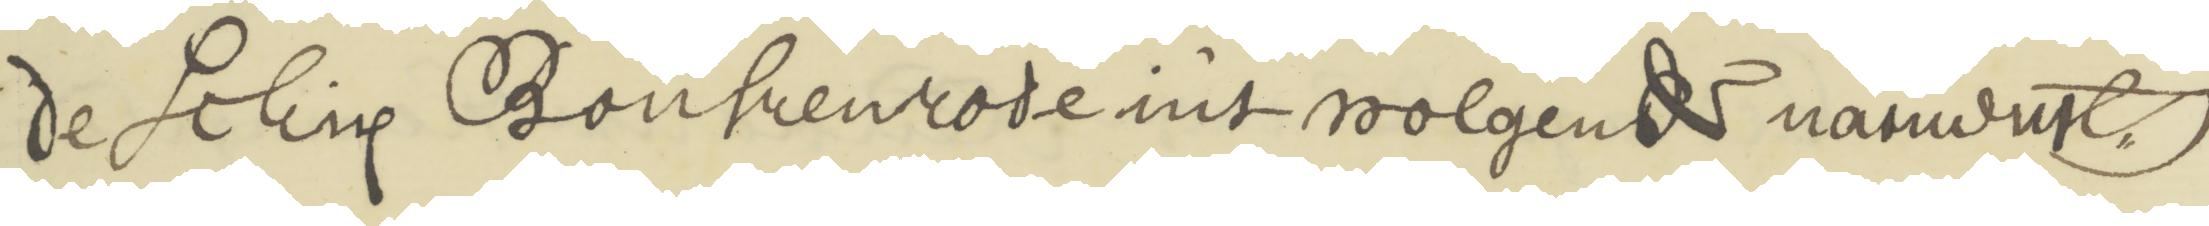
de Schip Bonkenrode in't volgende namentlijk
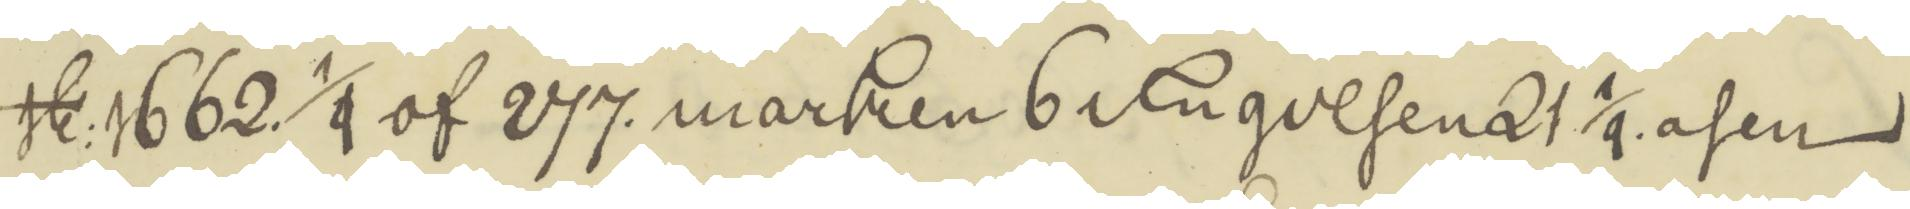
Tk: 1662.¼ of 277. marken 6 Engelsen 21¼. asen
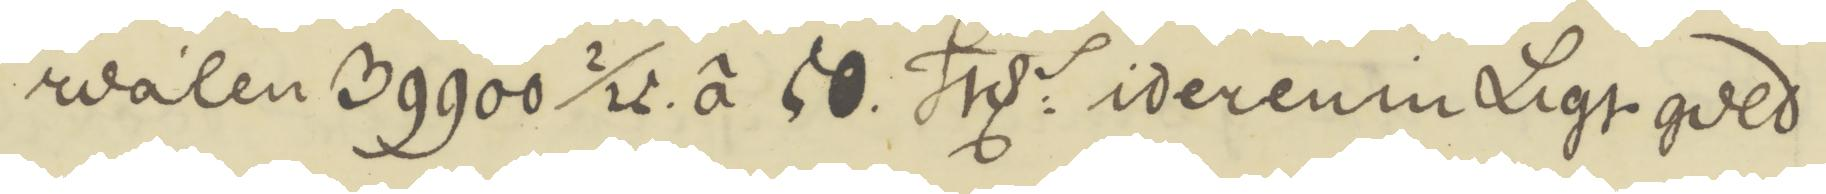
realen 39900 2/25. â 50. Stver:s iderenin Ligt geld
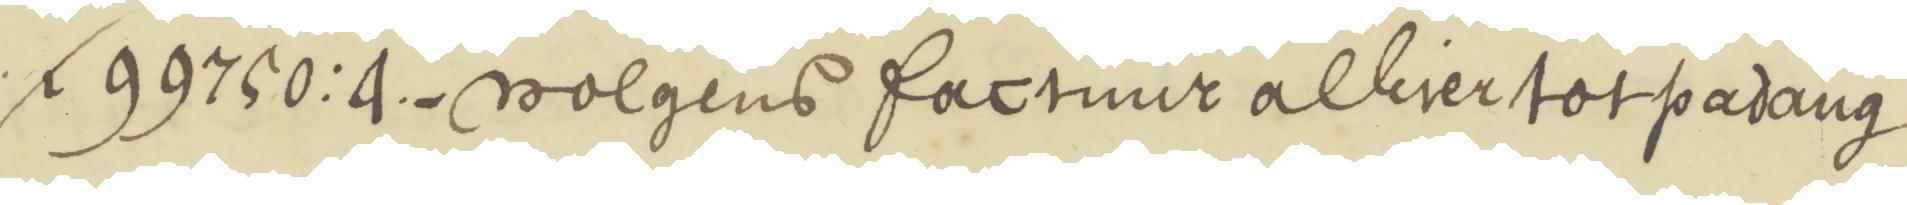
ƒ99750:4._ volgens factuur alhier tot padang
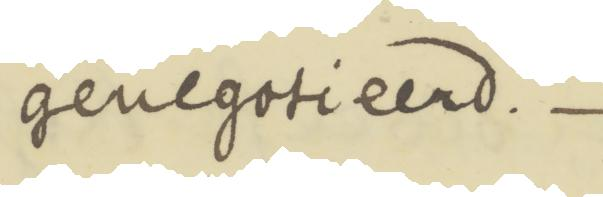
genegotieerd.—
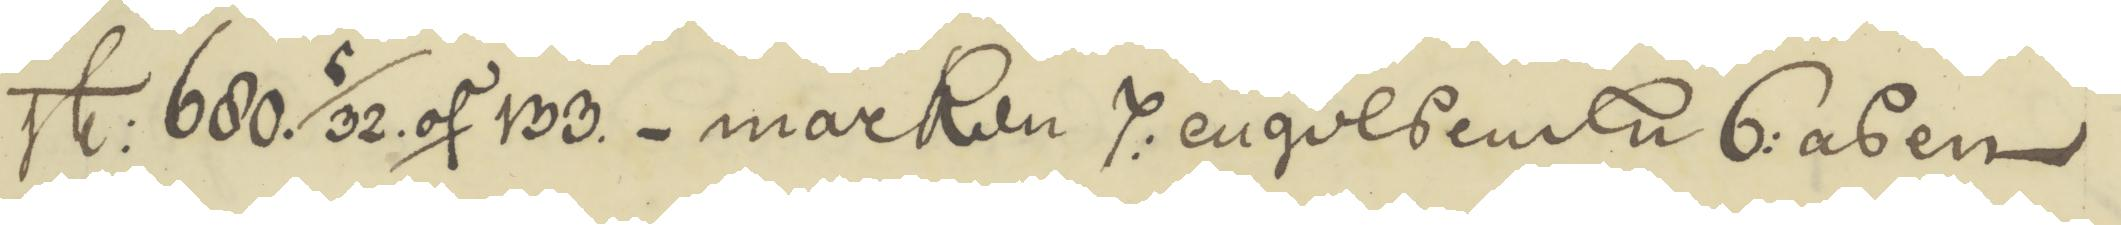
Tk: 680.5/32. of 133.- marken 7: engelsen en 6: asen
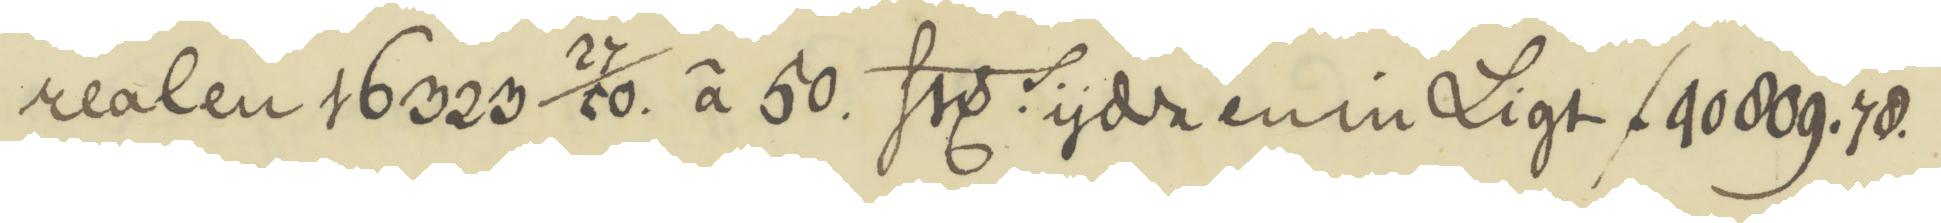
realen 16323 27/50. â 50. stver:s ijder en in Ligt ƒ40809.78.
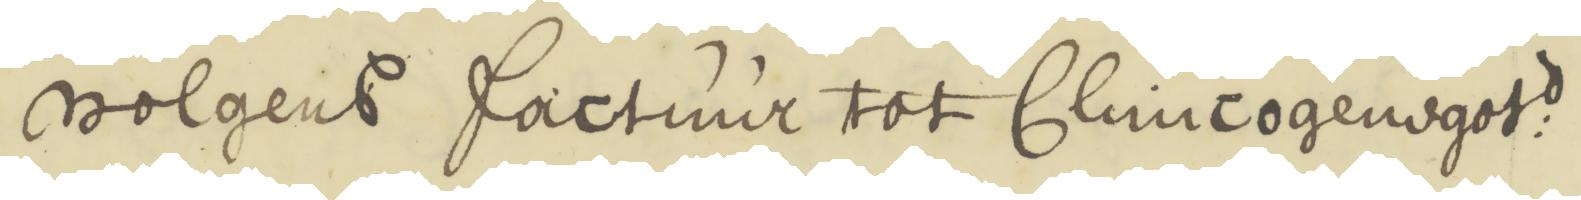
volgens factuur tot Chinco genegot:d
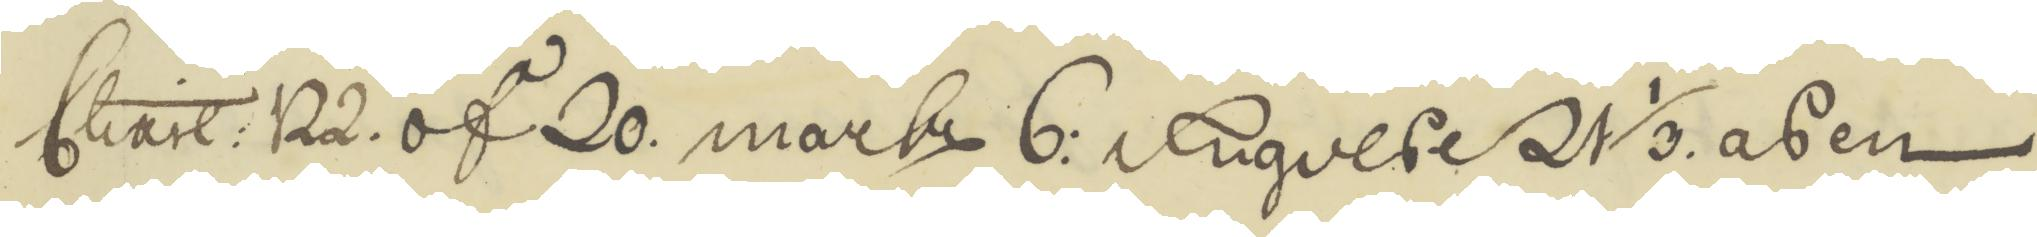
Chail: 122. of 20. mark 6: Engelse 21 1/3. asen
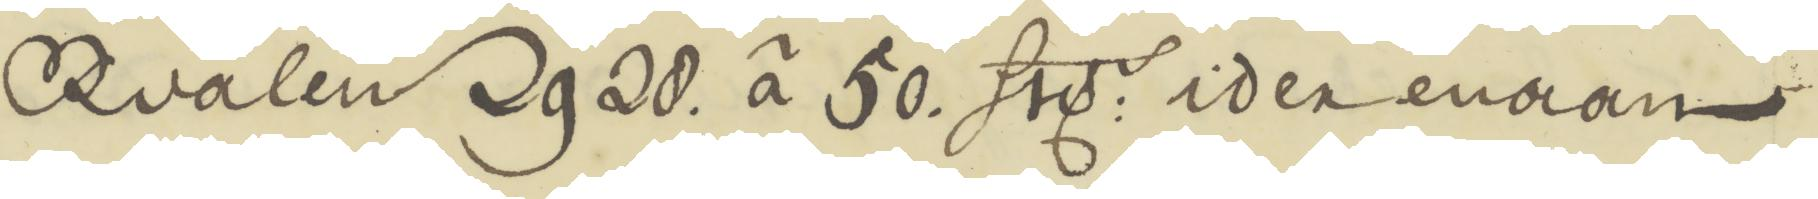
Realen 2928. â 50. stver:s ider en aan
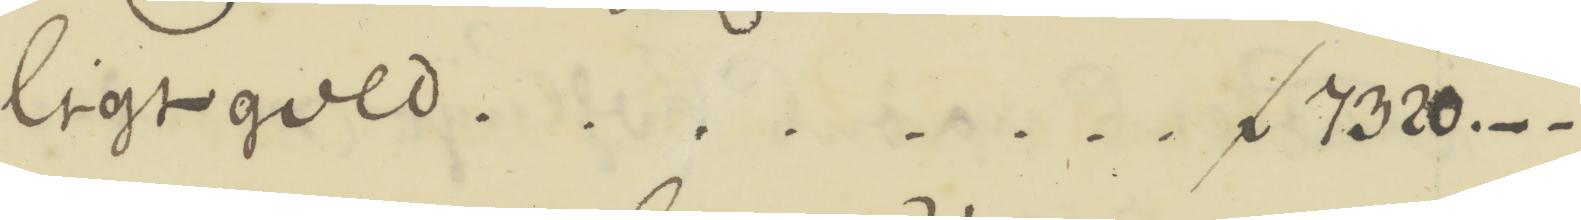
ligt geld.- - - - - - - - ƒ7320. - -
